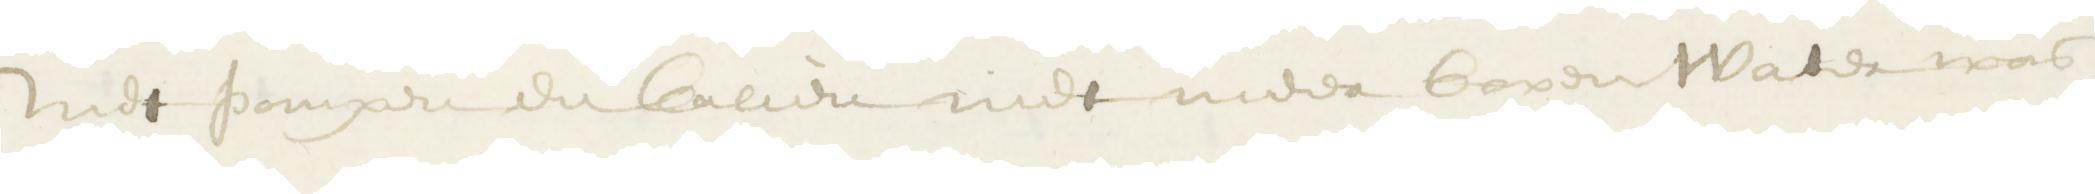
met pompen en balien niet meer boven water was
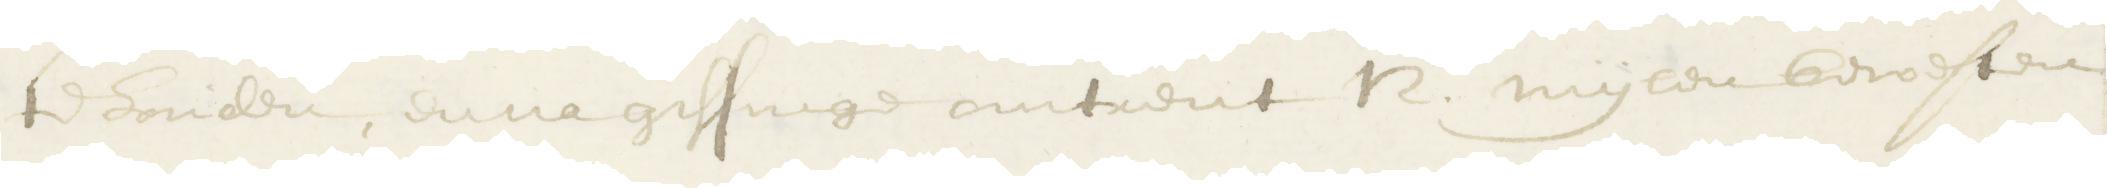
te houden, en na gissinge omtrent 12: mijlen bewesten
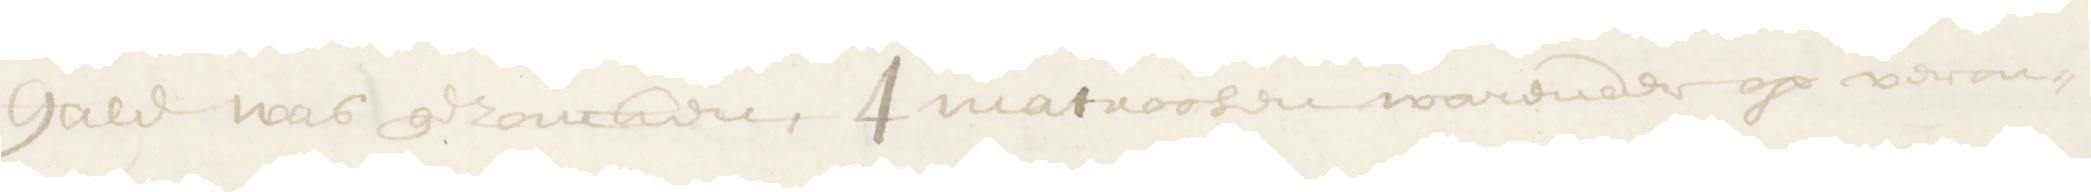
gale was gezoncken, 4 matroosen warender op veron„
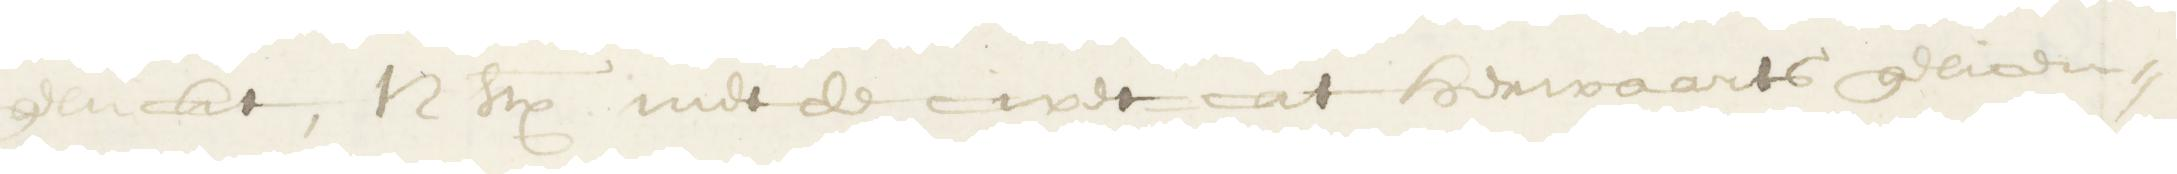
geluckt, 12 stx met de civetcat herwaarts gelicen„
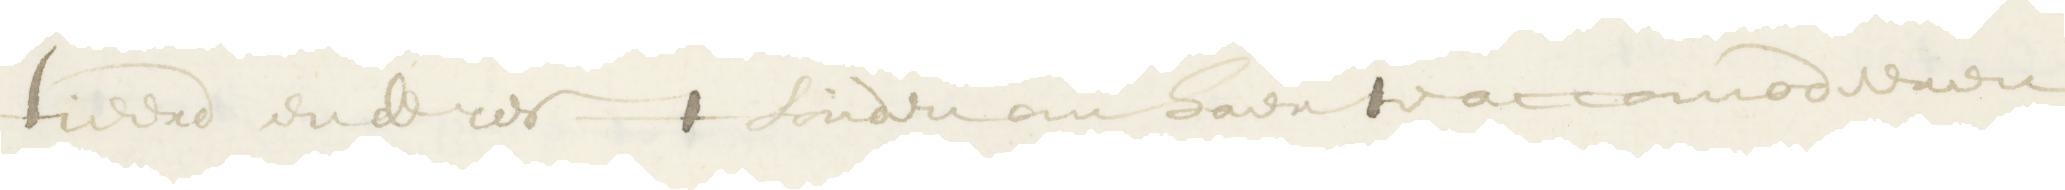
tieerd en de rest souden om haer te accomodeeren
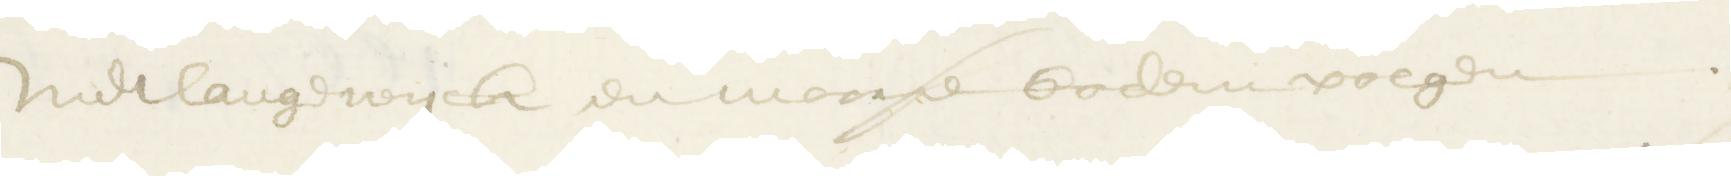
met langewijck en moorse bodem volgen.
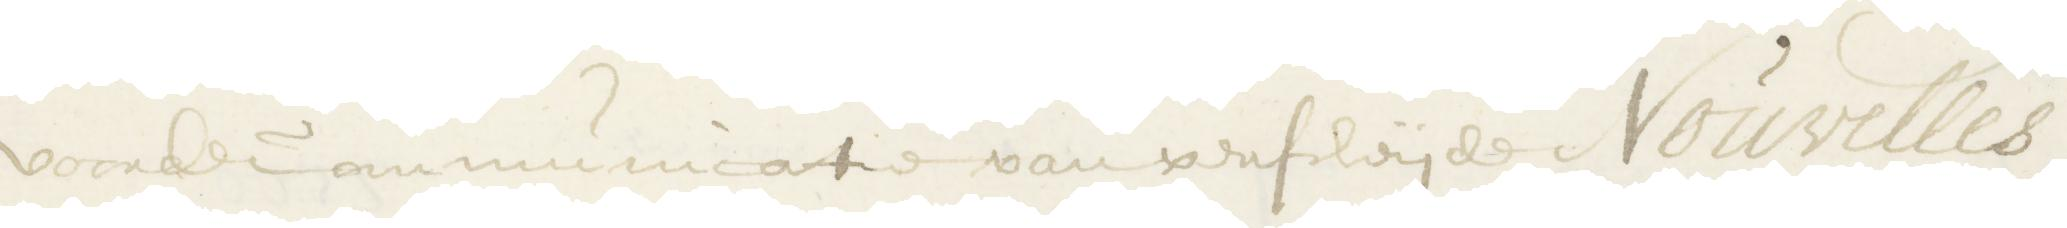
voor de Communicatie van verscheijde Nouvelles
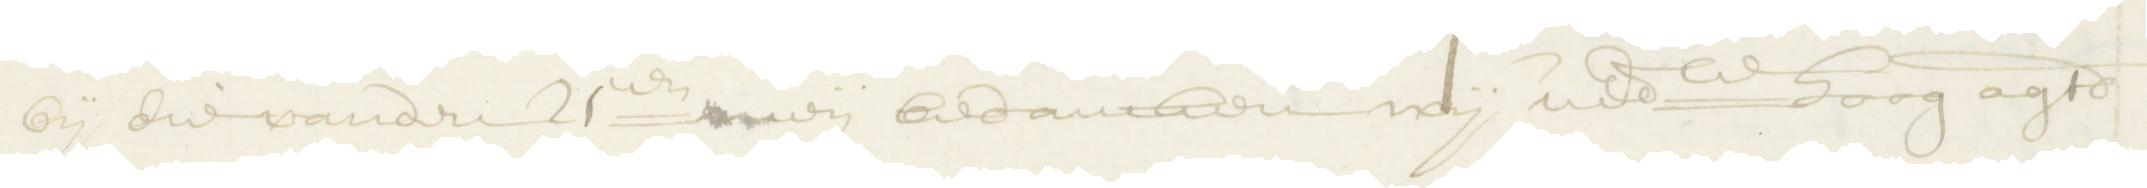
bij die vanden 25=en meij bedancken wij uEd=le hoog agtb:
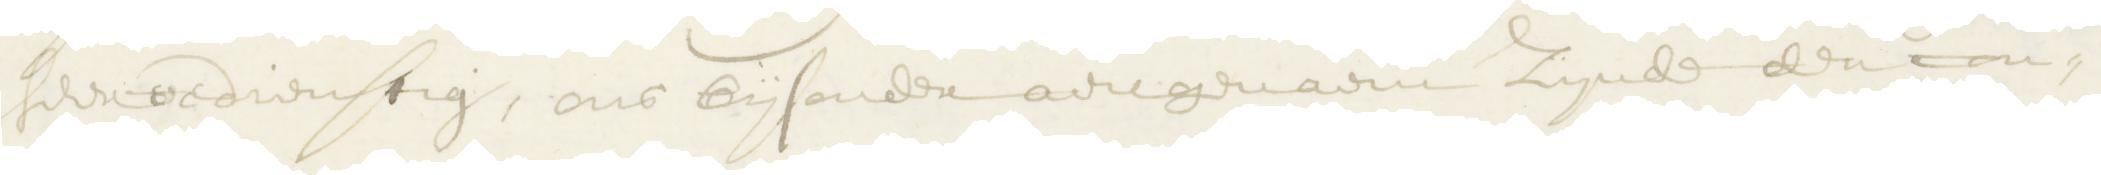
seer bedienstig, ons bijsonder aengenaem zijnde den con„
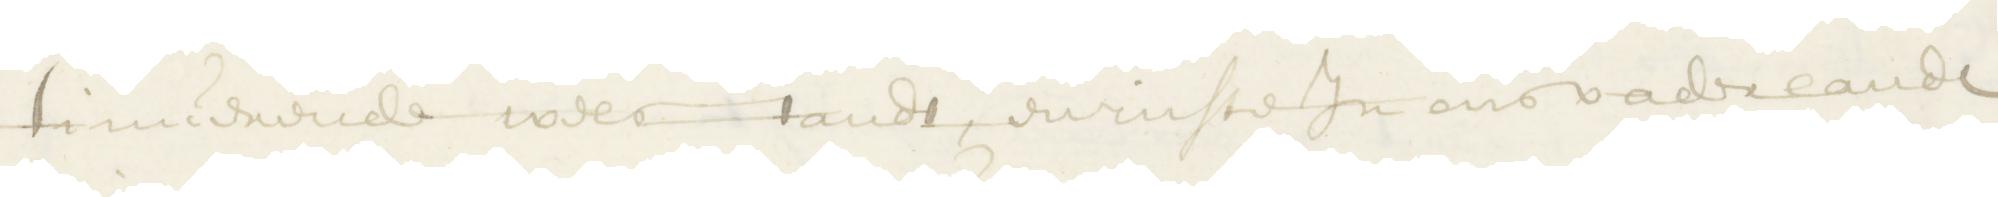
tinuerende welstandt, en ruste Jn ons vaderlandt
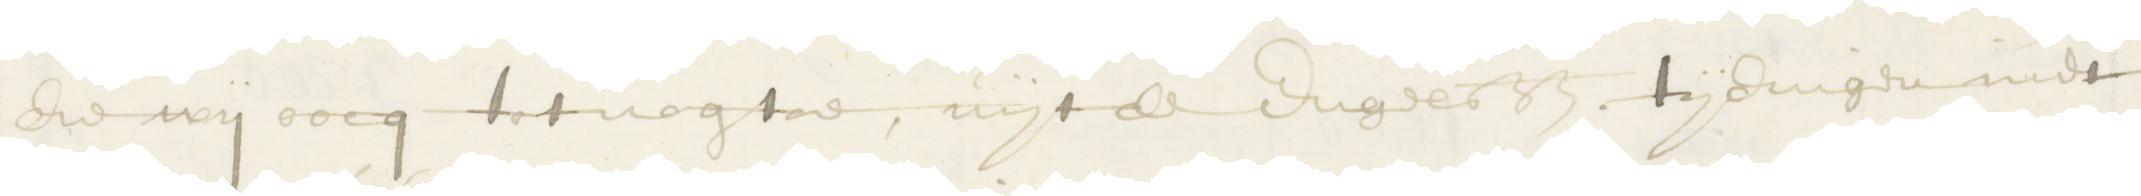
die wij oocq tot nog toe, uijt de Engelstz. tijdingen niet
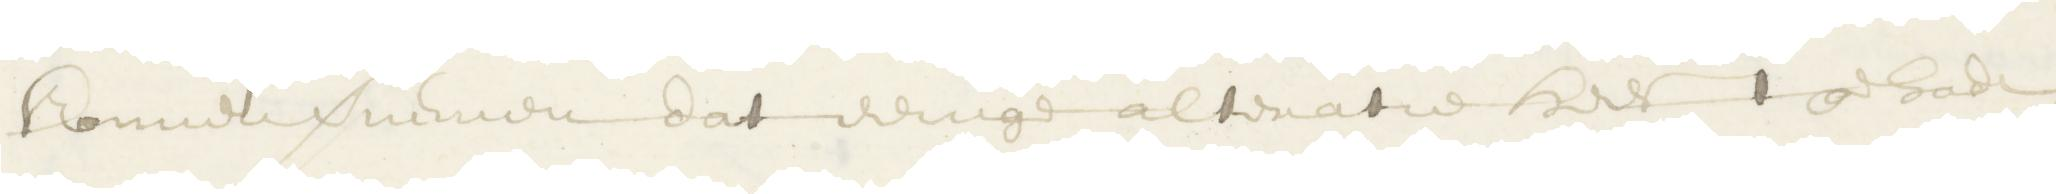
konnen vernemen dat eenige alteratie heeft gehaden
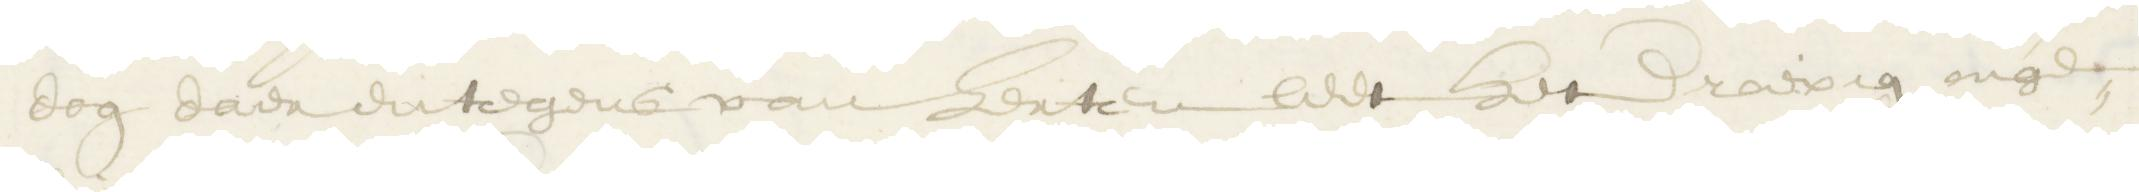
dog daer en tegens van herten leet het droevig onge„
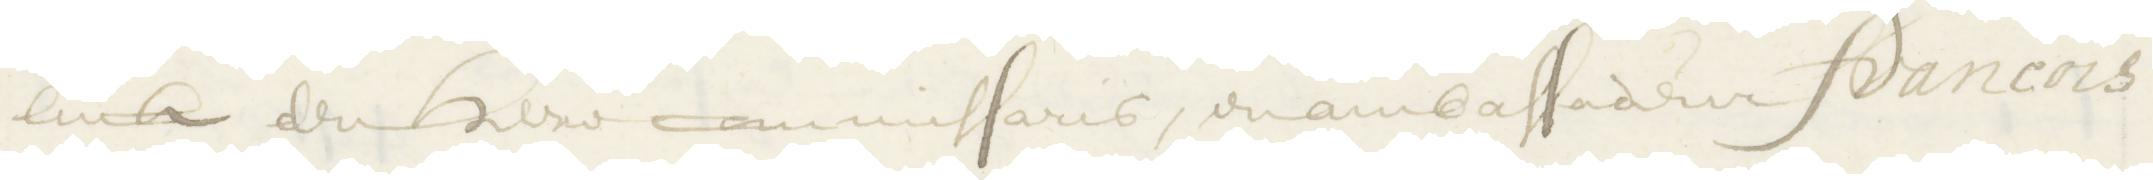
luck den heere commissaris, en ambassadeur francois
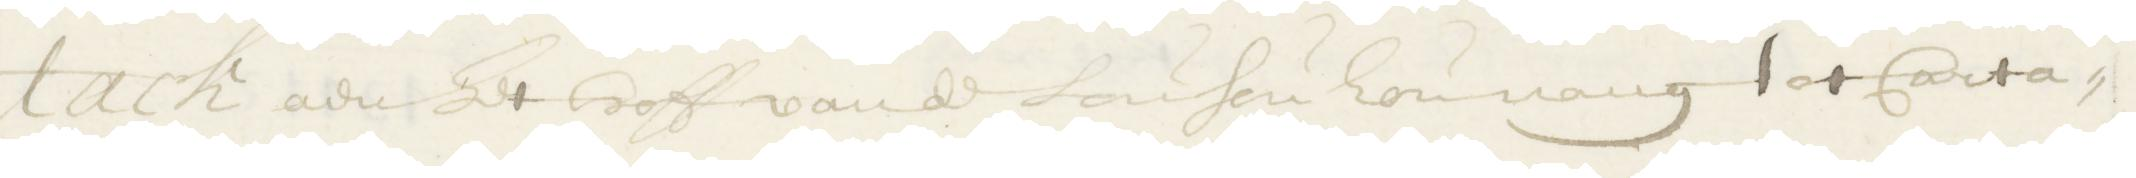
tack aen het hoff van de sousouhounang tot Carta„
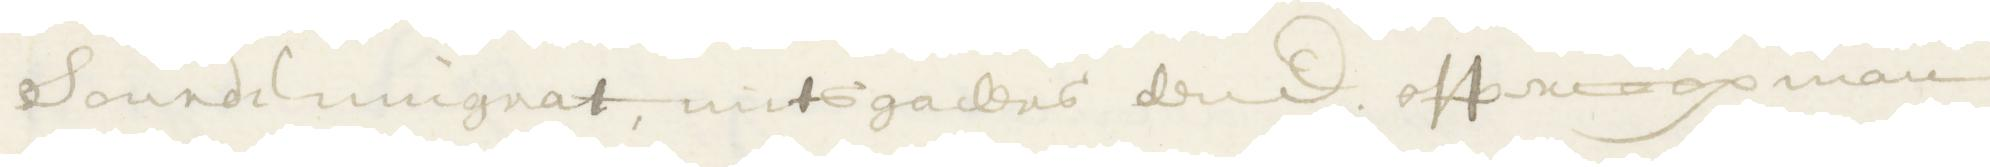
sourdeningrat, mitsgaders den E. oppercoopman
